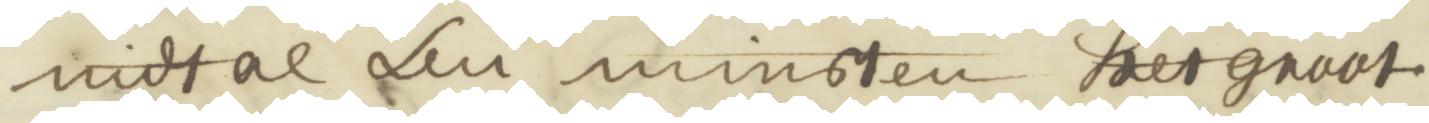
niet al ten minsten het groot
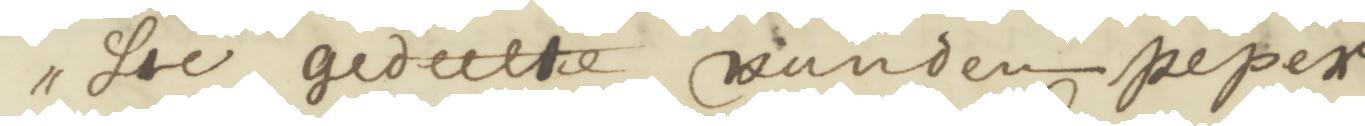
„ste gedeelte vanden peper
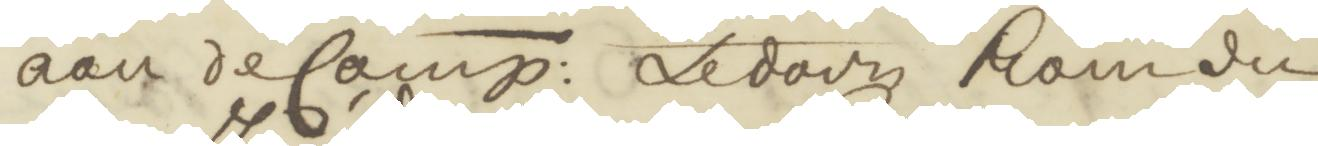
aan de Comp: te doen komen
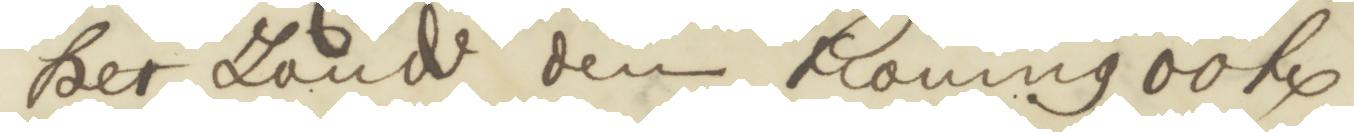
het zoude den koning ook
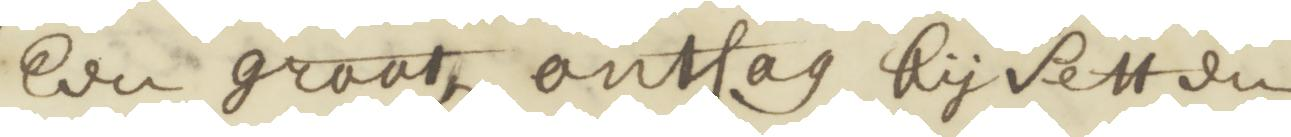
Een groot ontsag bijsetten
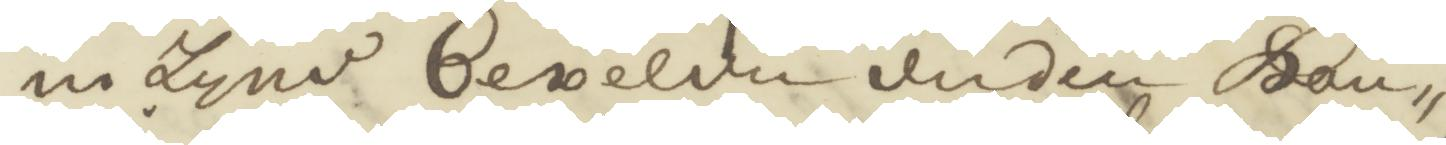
in zyne bevelen en den han„
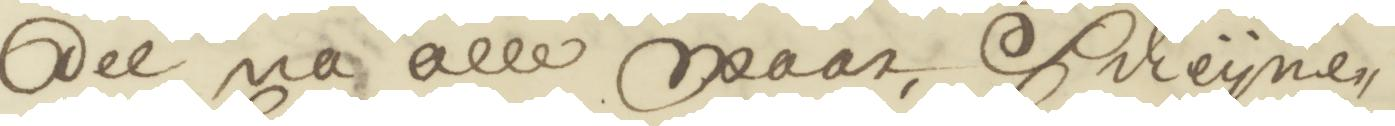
del na alle waar scheijne„
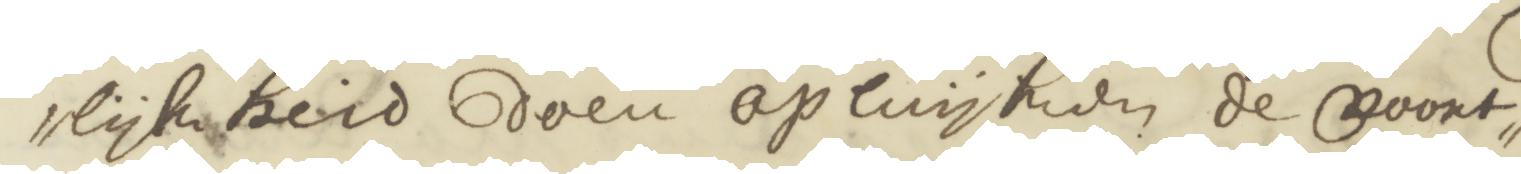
„lijkheid doen opluijken de voort
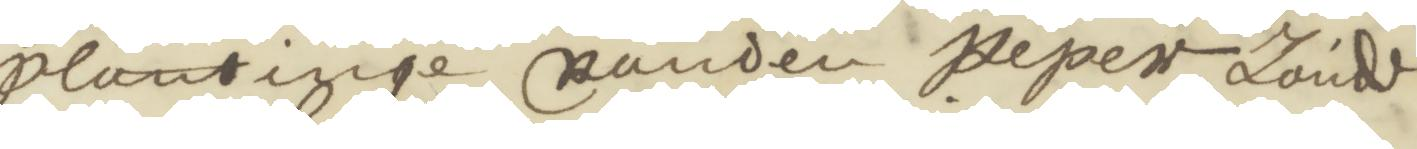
plantinge vanden peper zoude
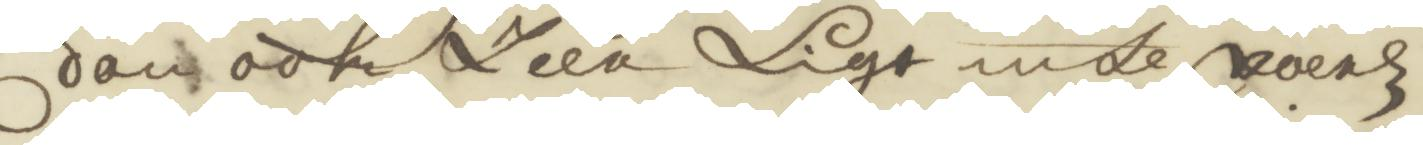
dan ook zeer Ligt in te voeren
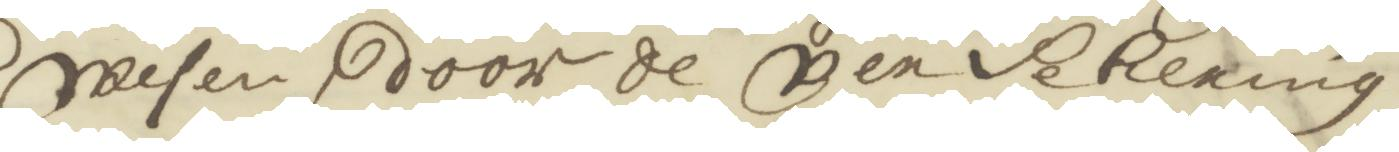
wesen door de versekering
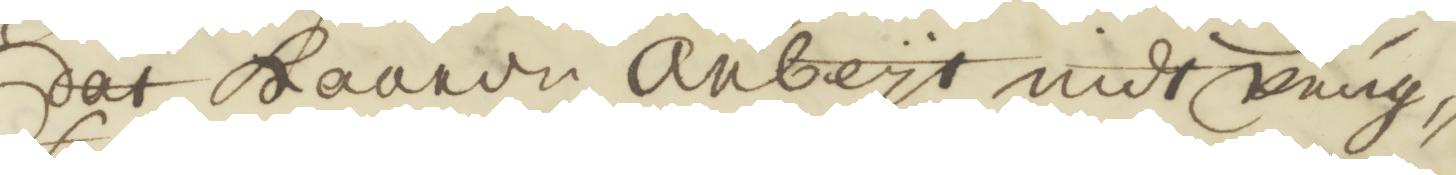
dat haaren arbeijt niet vrug
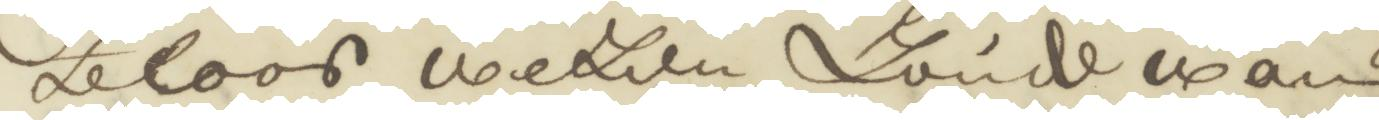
teloos wezen zoude wan
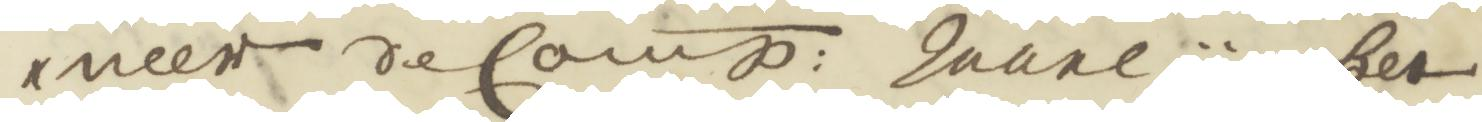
„neer de Comp: Jaarlijx het
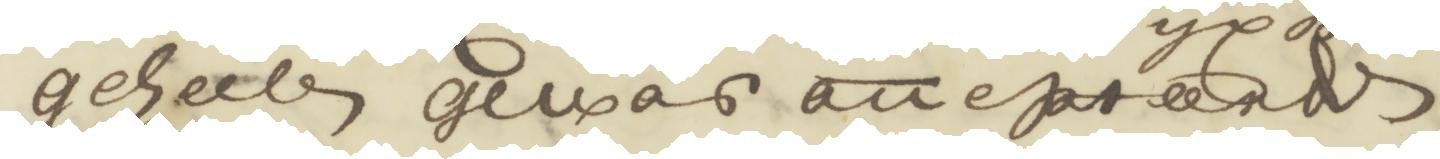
geheelen gewas accepteerden
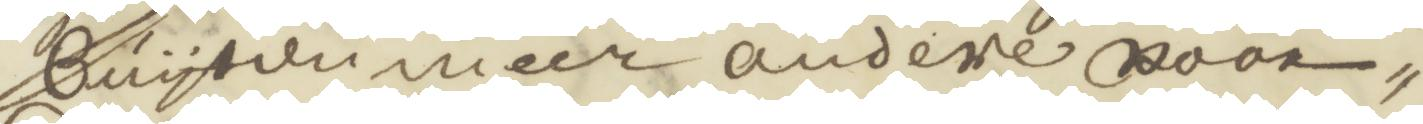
buijten meer andere voor„
